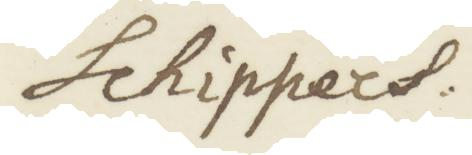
schippers.
